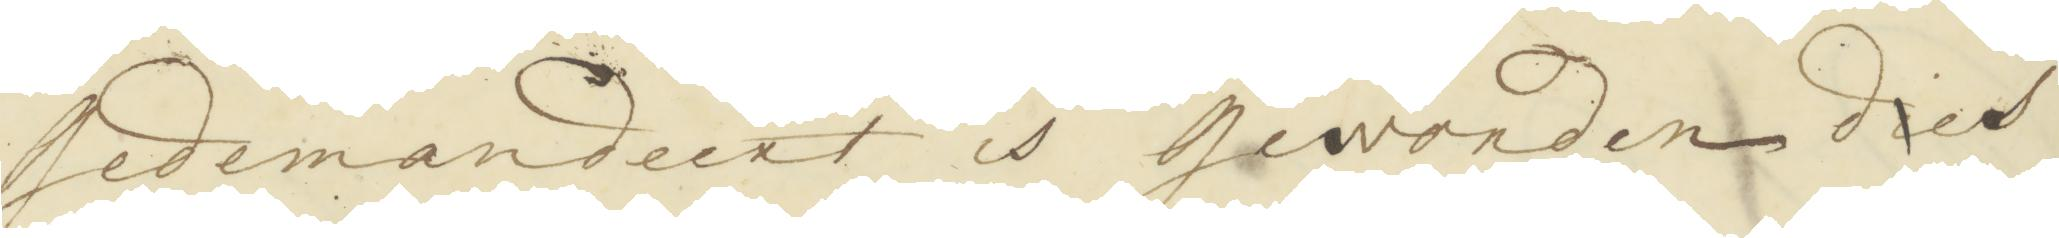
Gedemandeert is Geworden dies
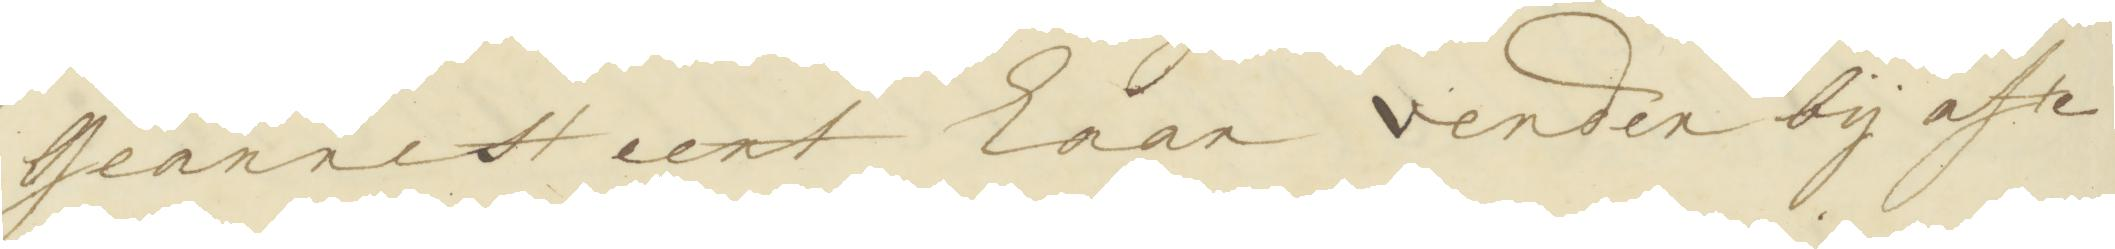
Gearresteert haar verder bij afte
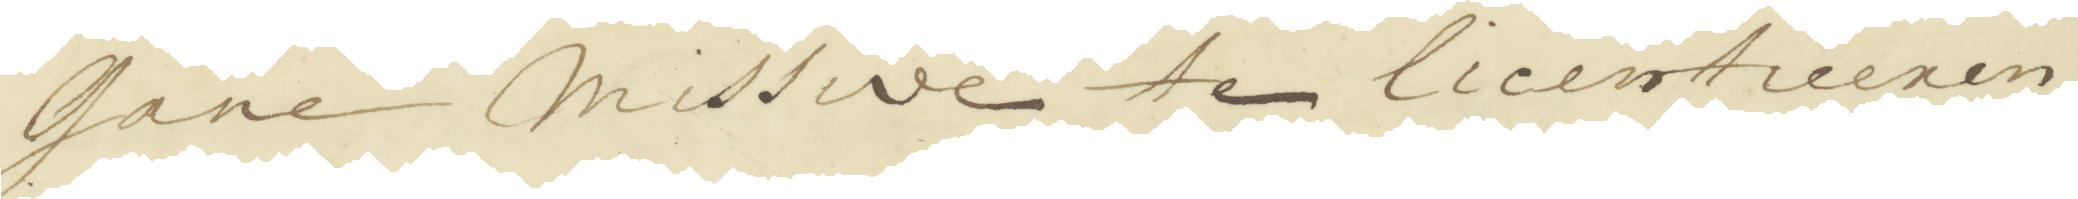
Gane Missive te licentieeren
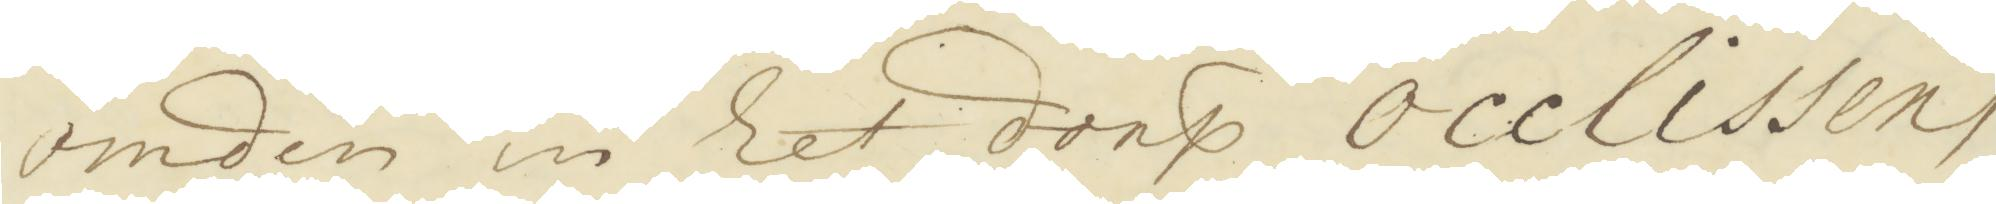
omden in het dorp occlissen,
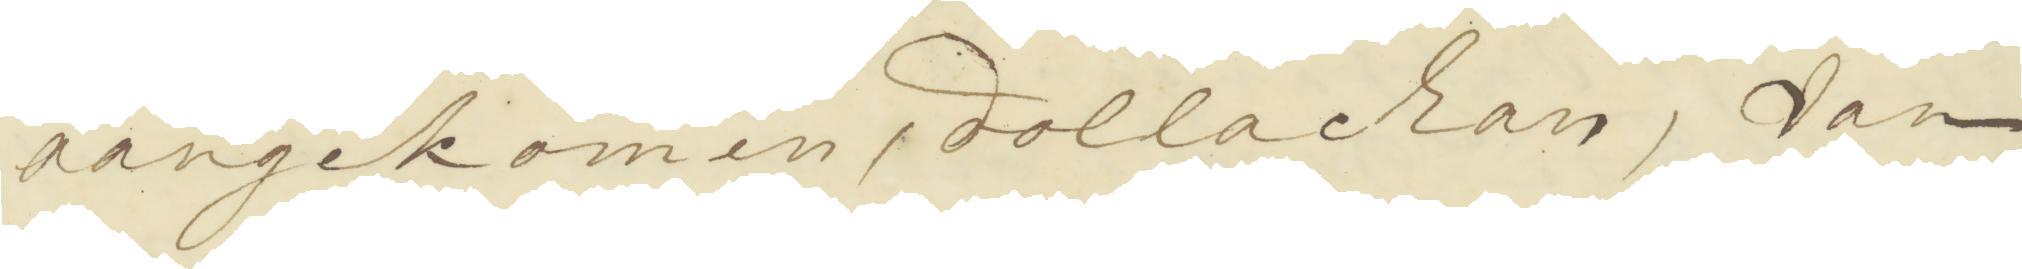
aangekomen, dollachan, van
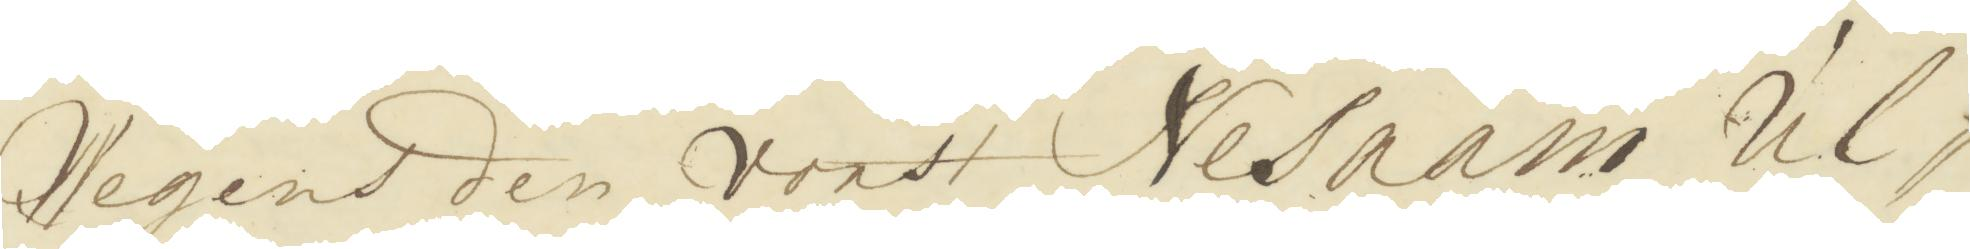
Wegens den Vorst Nesaam Ul
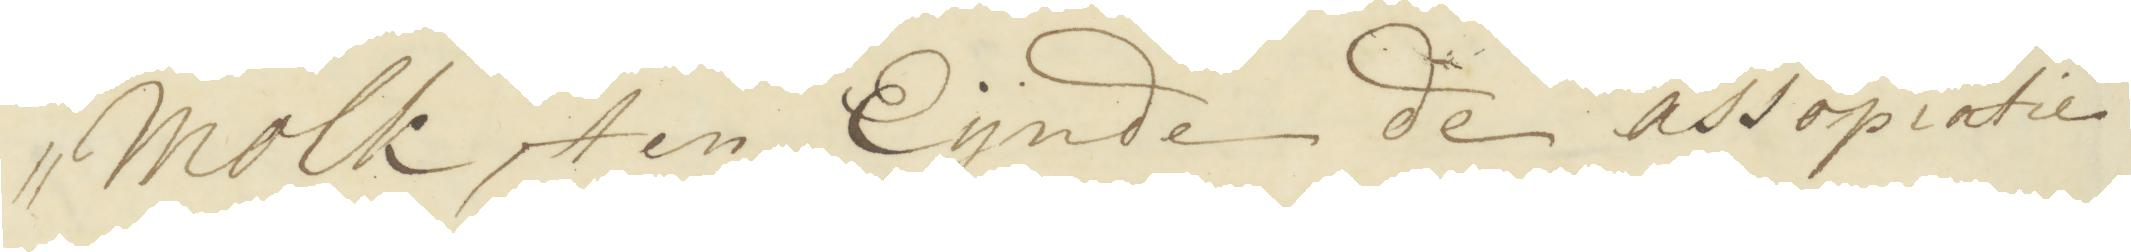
„Molk, ten Eijnde de assopiatie
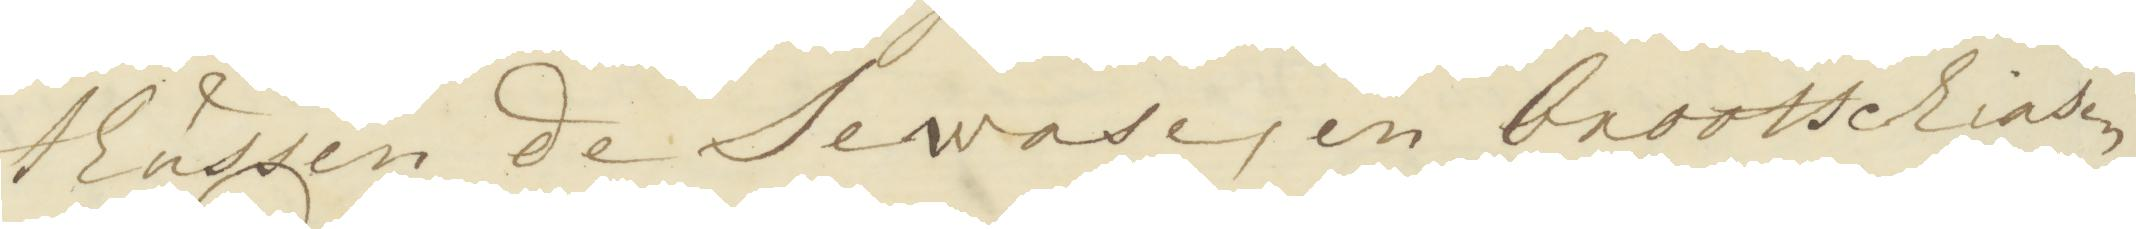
thussen de Sewase, en brootschiasen
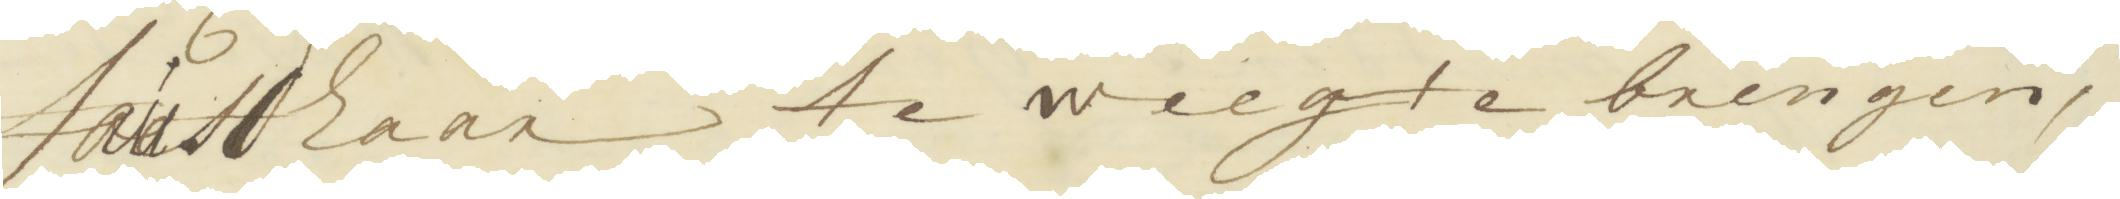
Jausdhaar te weegte brengen,
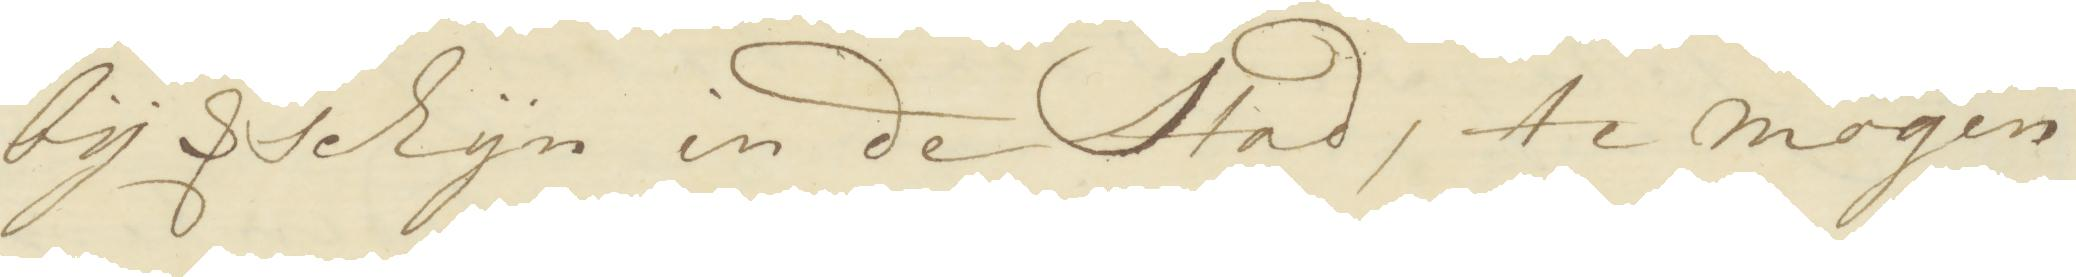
bij verschijn in de Stad, te mogen
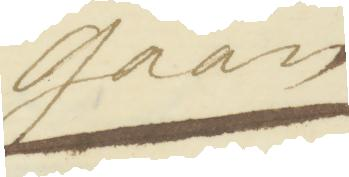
Gaan
